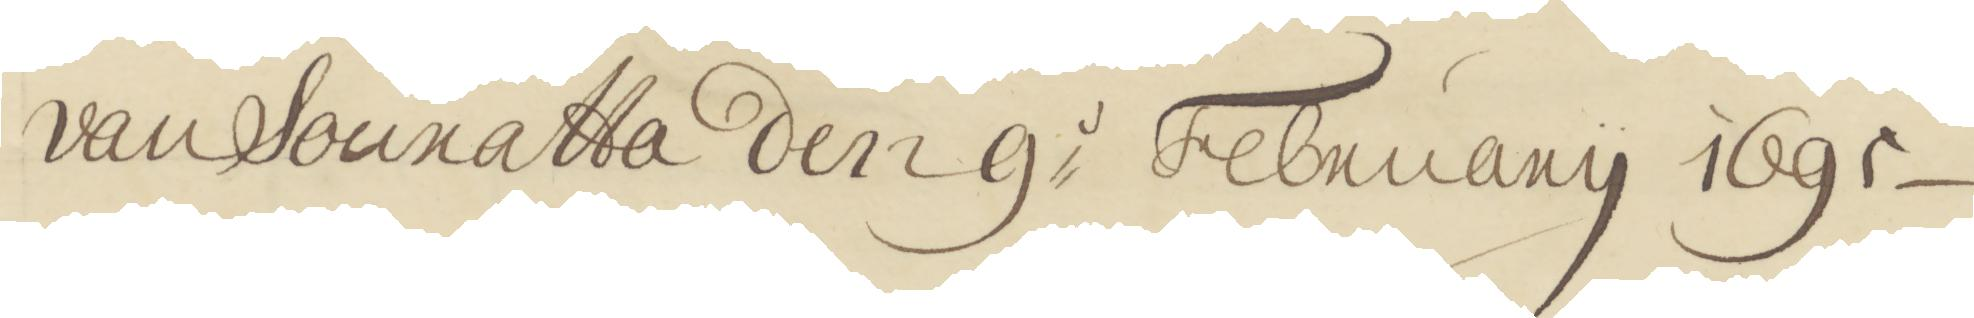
van Souratta den 9„e Februarij 1695 —
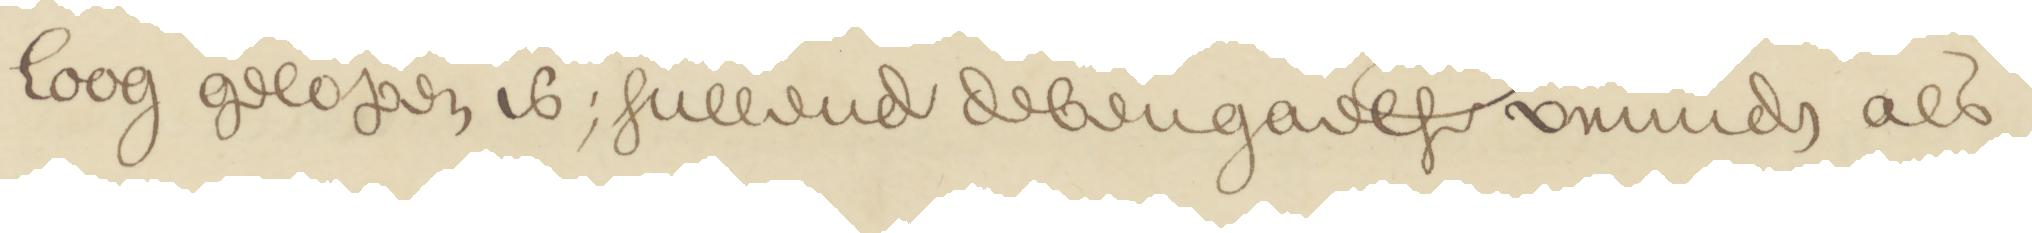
hoog gelopen is; sullende de bengaele vrunden als
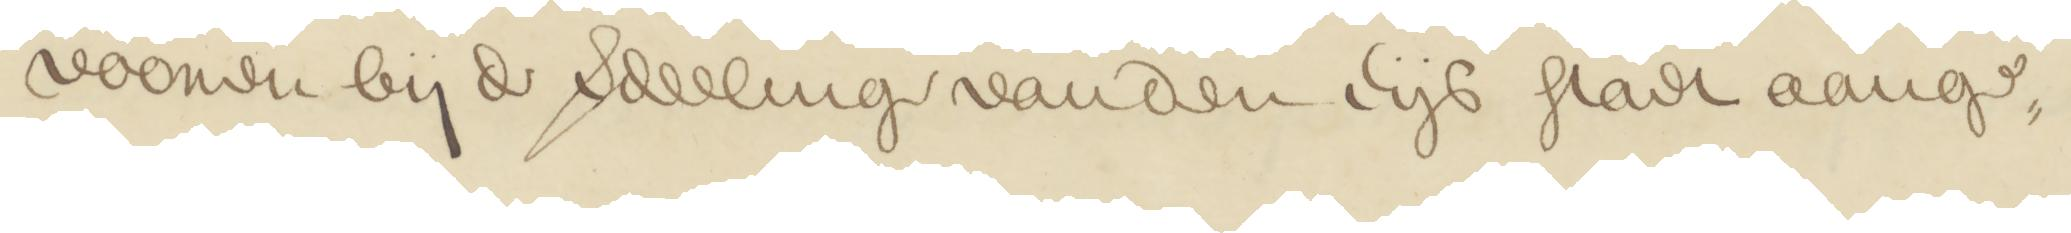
vooren bij de verdeelinge van den eijs staet aange„
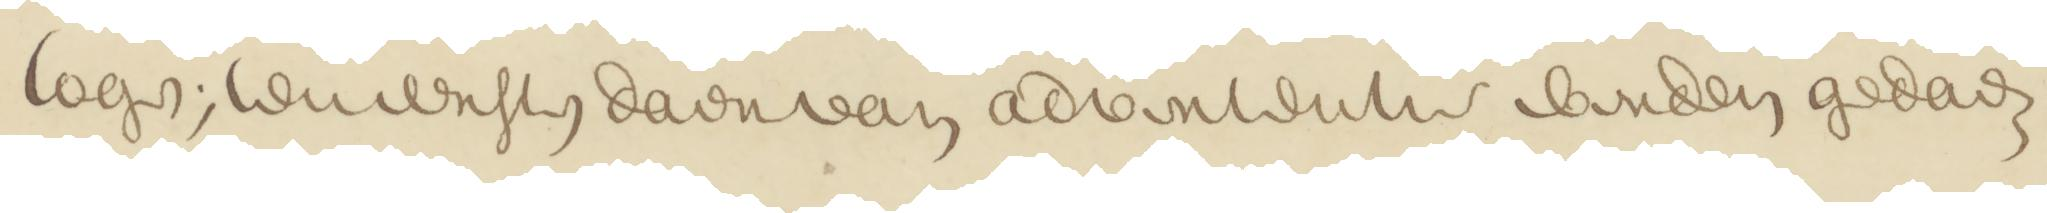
togen; ten eersten daer van advertentie werden gedaen
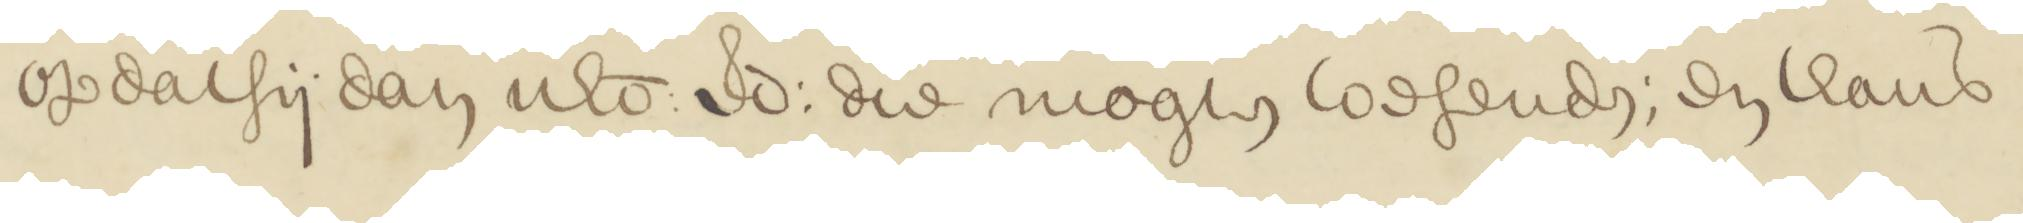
opdat sij dan uho: Ed: die mogten toesenden; en thans
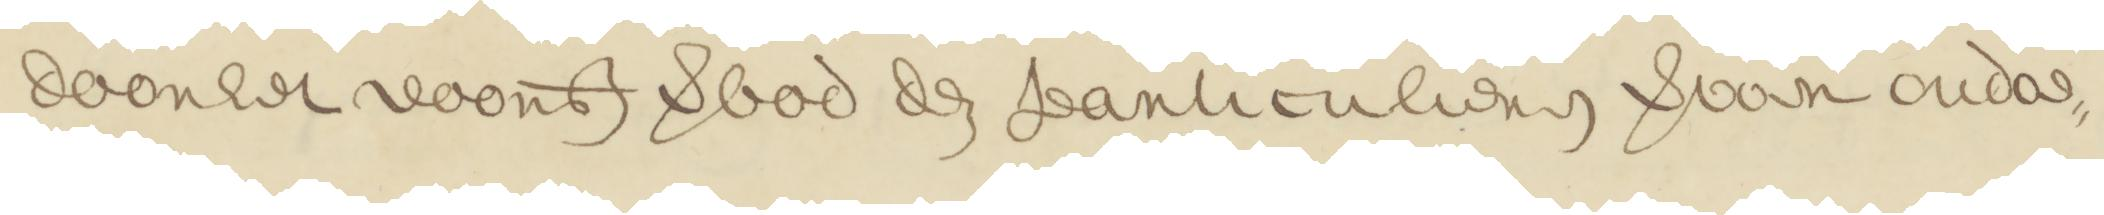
door het voors verbod den particulieren vervoer ondoe„
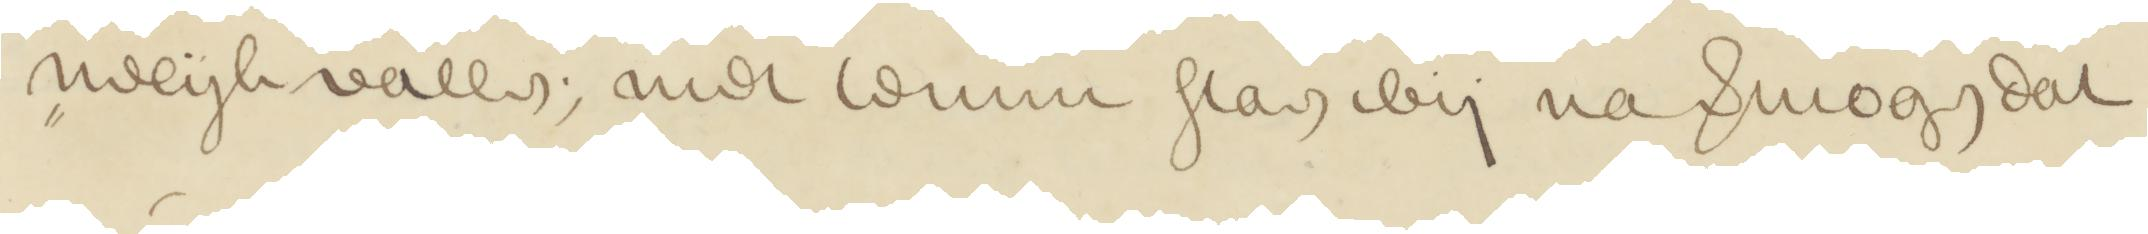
„nelijk vallen; niet temin staen wij na vermogen dat
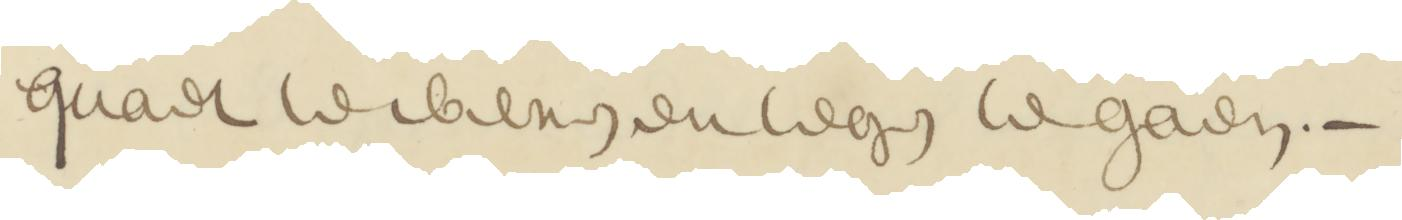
quaet te weren en tegen te gaen.-
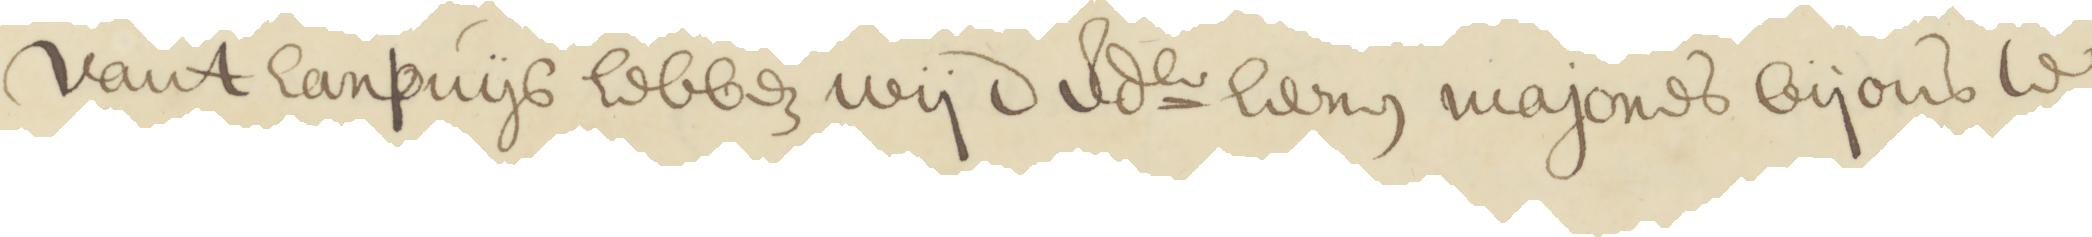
van’t harpuijs hebben wij 'd Ed=le heeren majores bij ons te
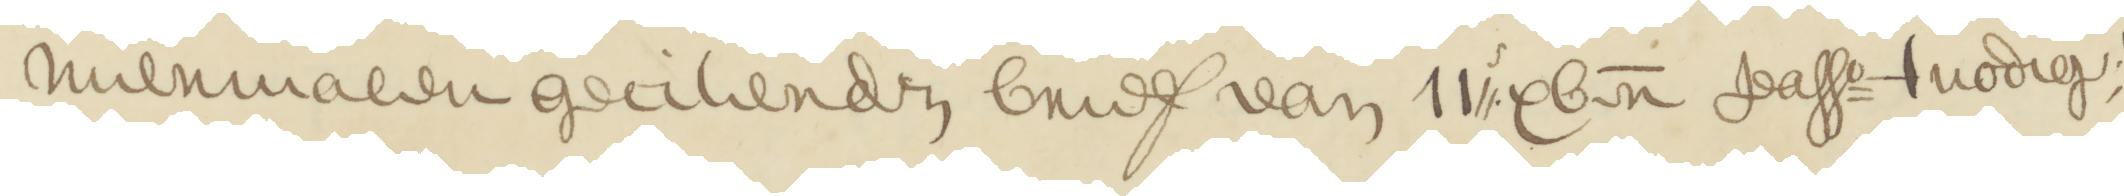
mermalen geciterden brief van 11„s: xber pass=o 'tnodig;
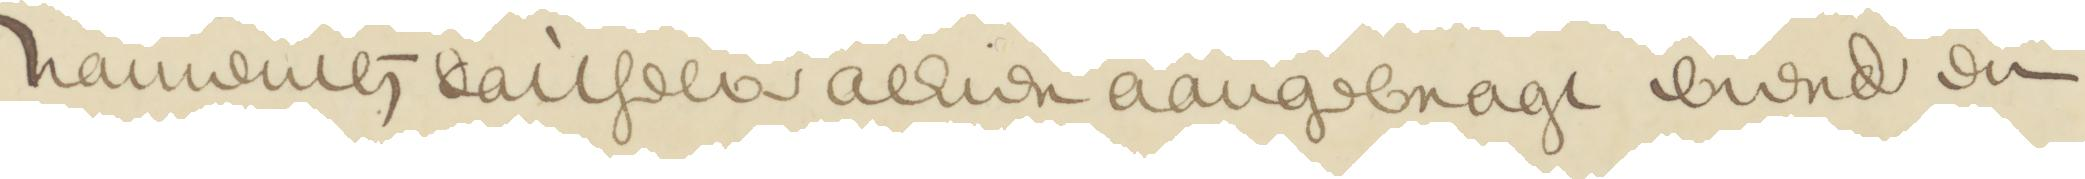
Namentlijk dat 'tselve alhier aangebragt vierde en
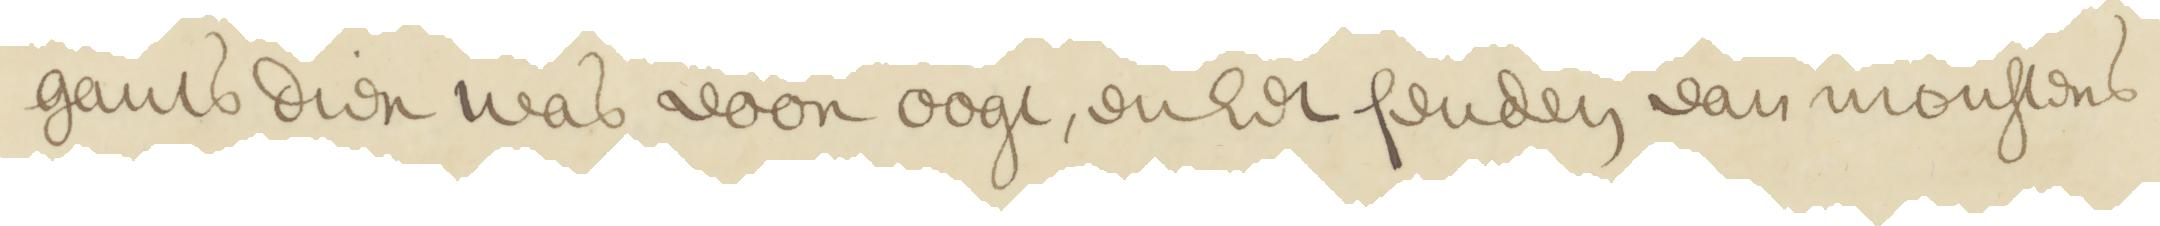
gants dier was voor oogt, en het senden van monsters
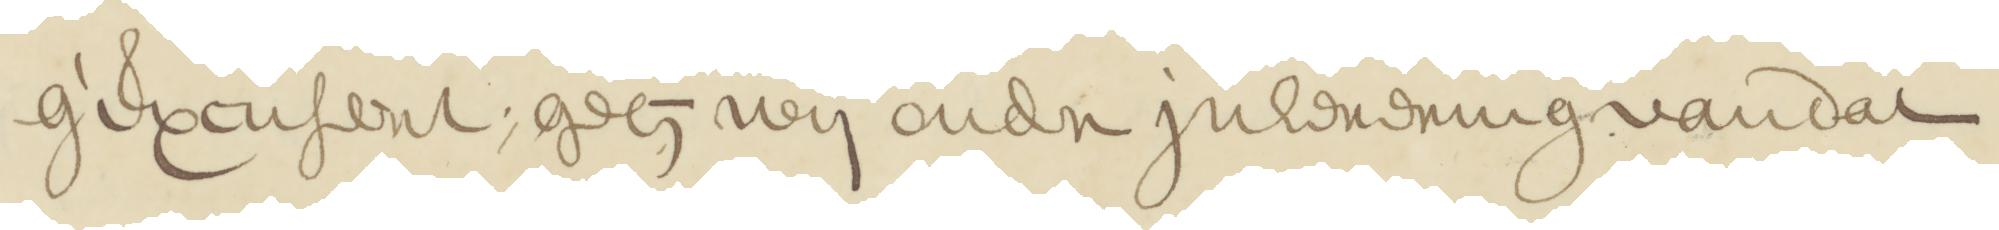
g’Excuseert; gelijk wij onder jnherering van dat
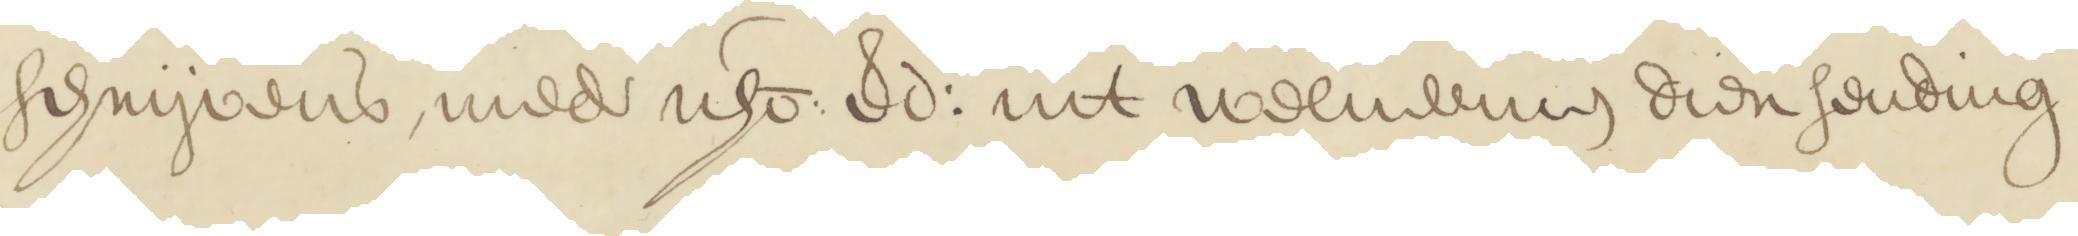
schrijvens, mede uho: Ed: in't welneemen dier sending
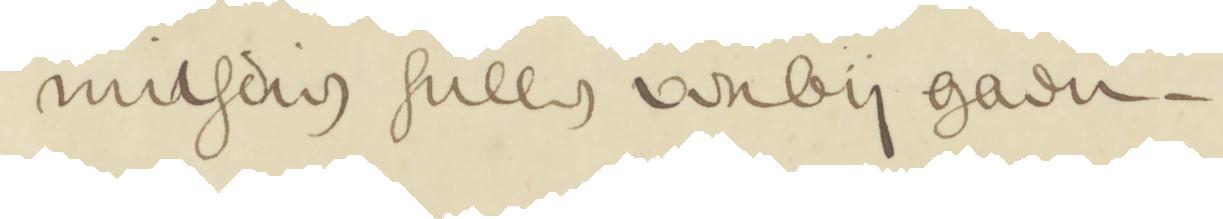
mitsdien sullen verbij gaen -
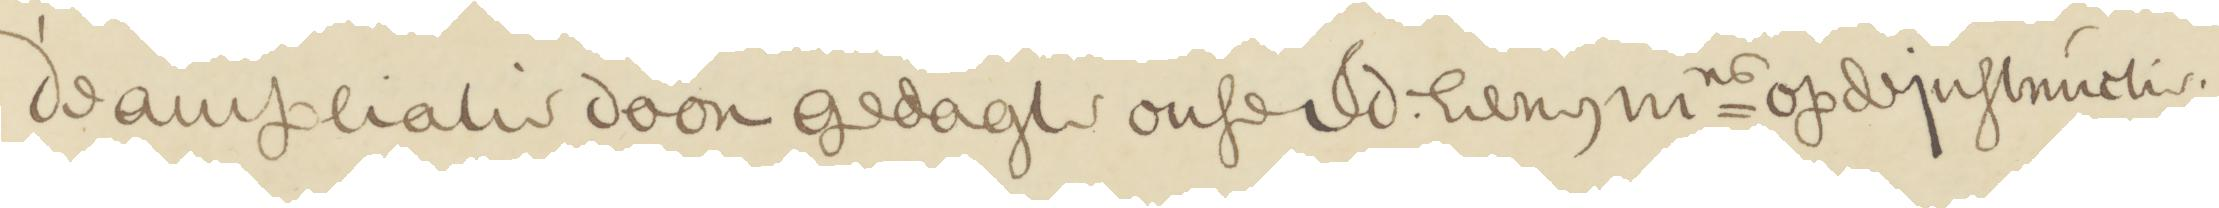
d'e ampliatie door gedagte onse Ed. heeren m=rs op de jnstructie;
